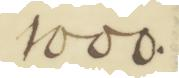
1000.
